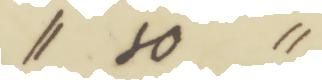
„ 10 „
